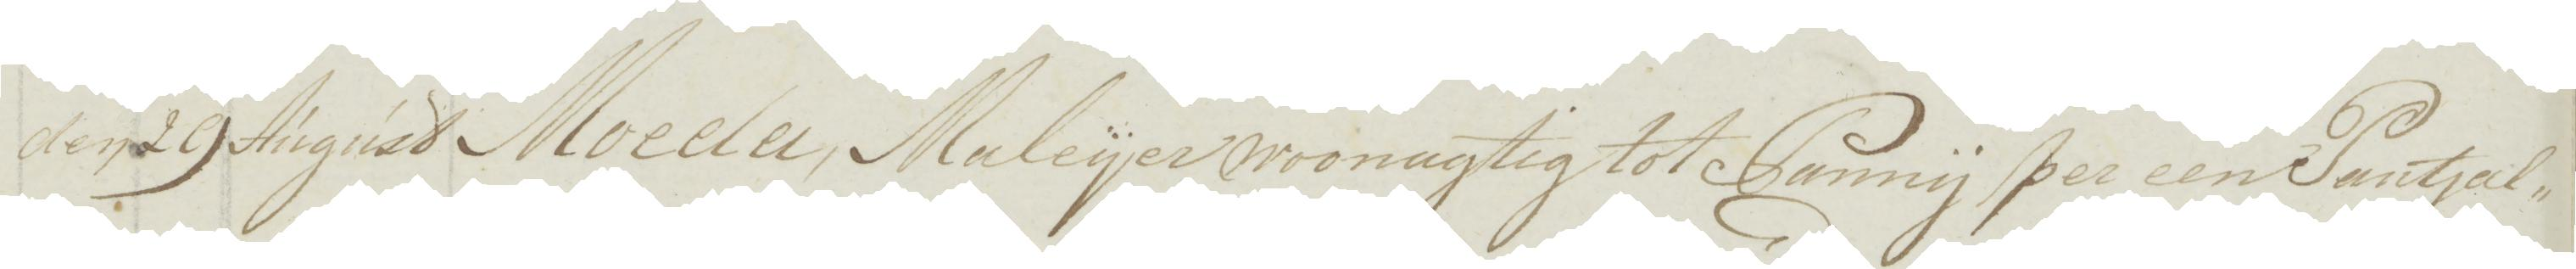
den 29 August Moeda, Maleijer woonagtig tot Pannij per een Pantjal„
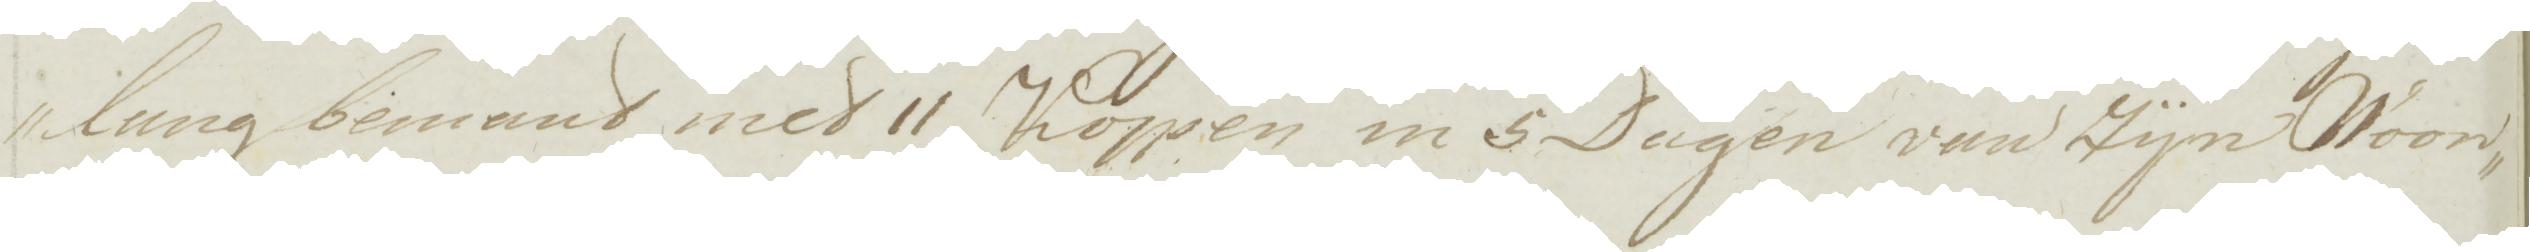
„lang bemant met 11 Koppen in 5 Dagen van Zijn Woon„
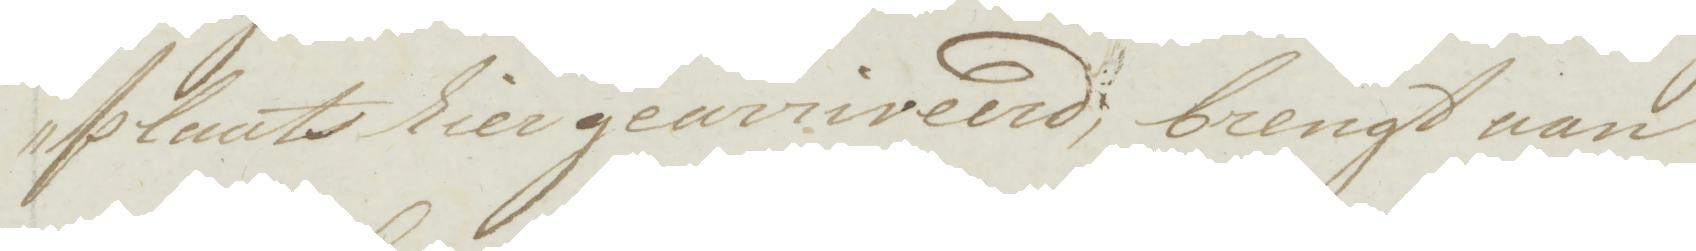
plaats hier gearriveerd; brengt aan
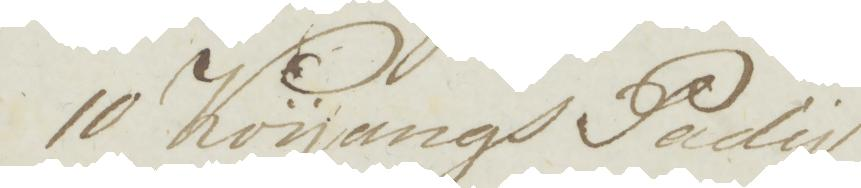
10 Koijangs Padij
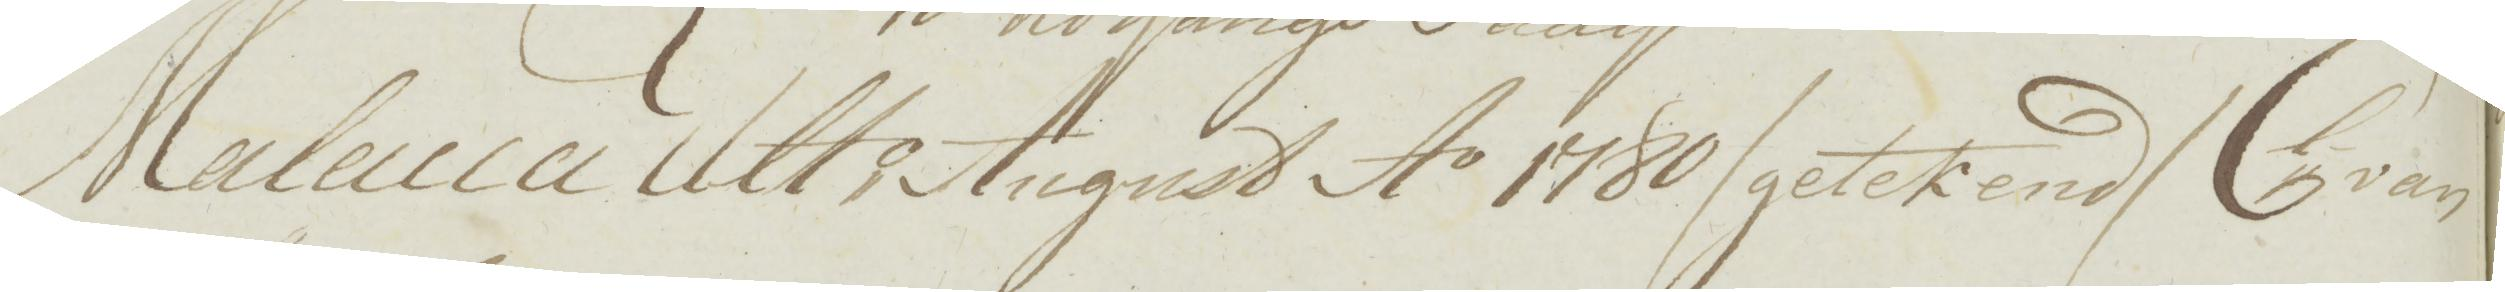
Malacca Ult„o August A:o 1780 /getekend/ C:l van
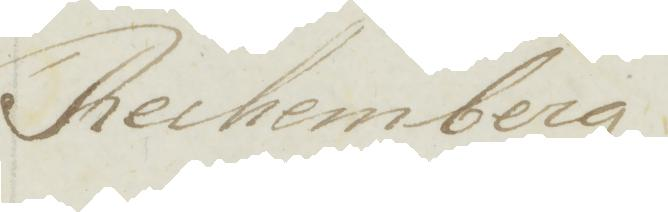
Rechemberg.
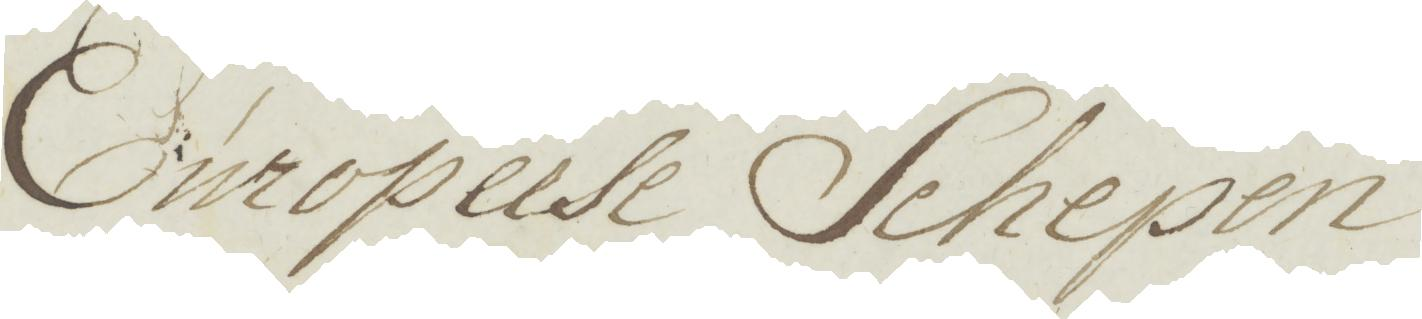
Europeese Schepen
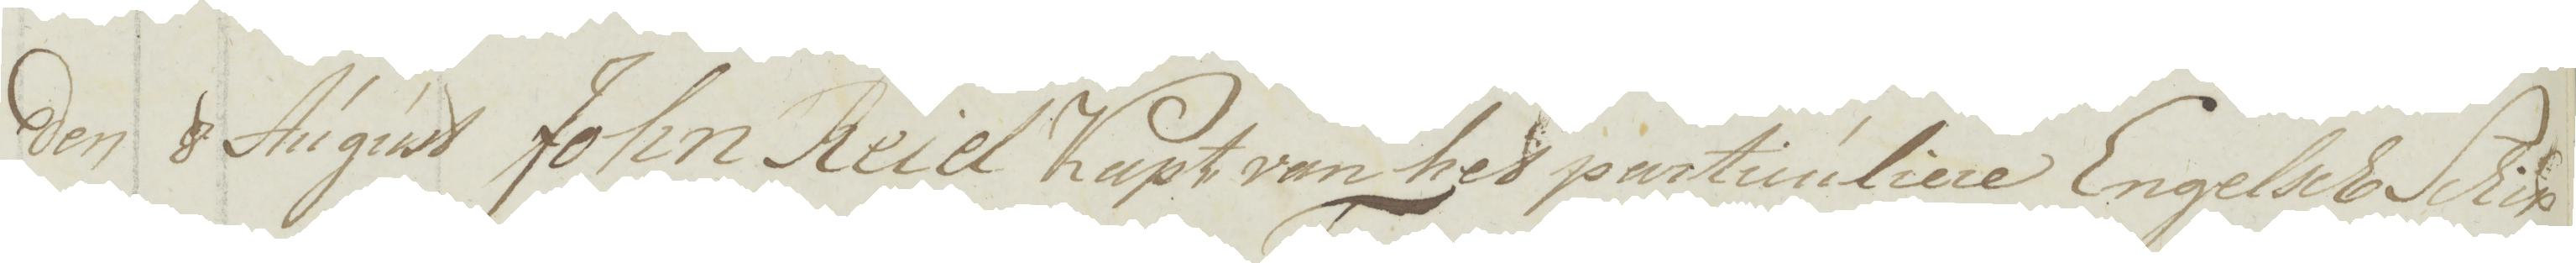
den 8 August John Reid Kapt van het particuliere Engelsch schip
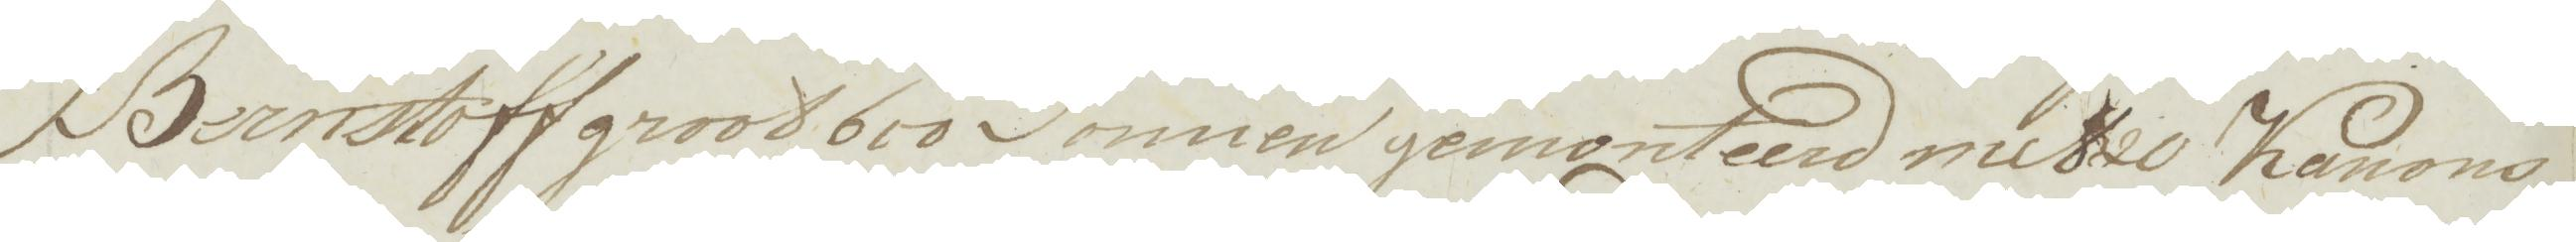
Bernstoff groot 600 Tonnen gemonteerd met 20 kanons
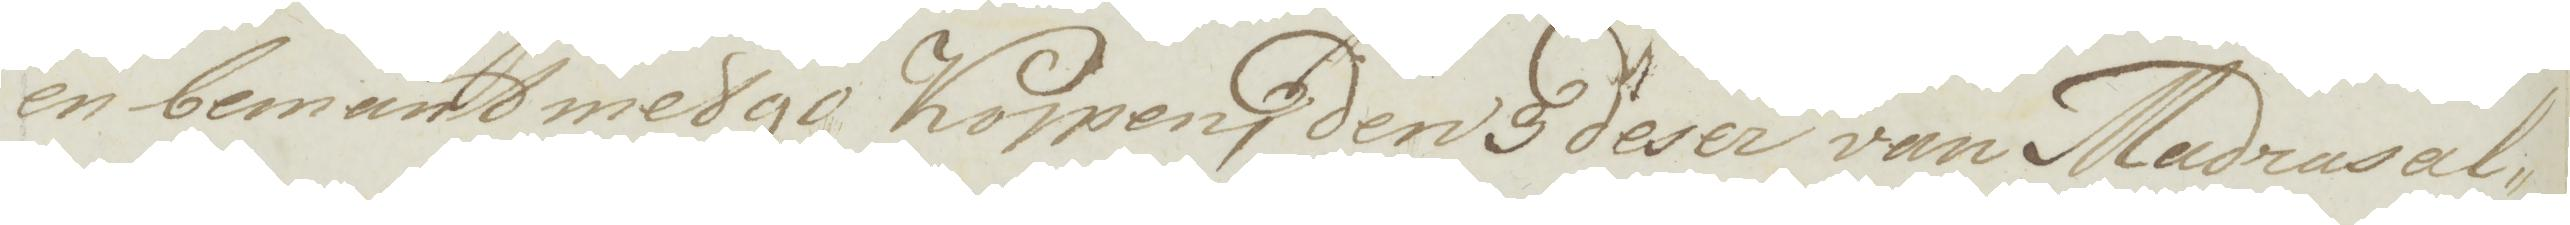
en bemant met 90 Koppen den 3 deser van Madras al„
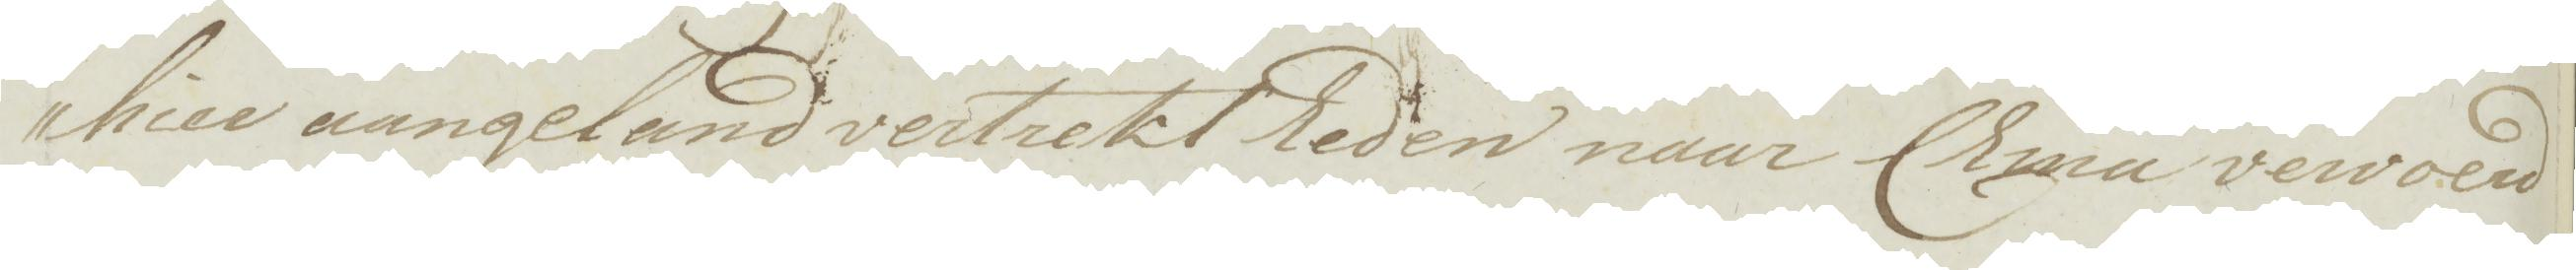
„ hier aangeland vertrekt heden naar China vervoerd
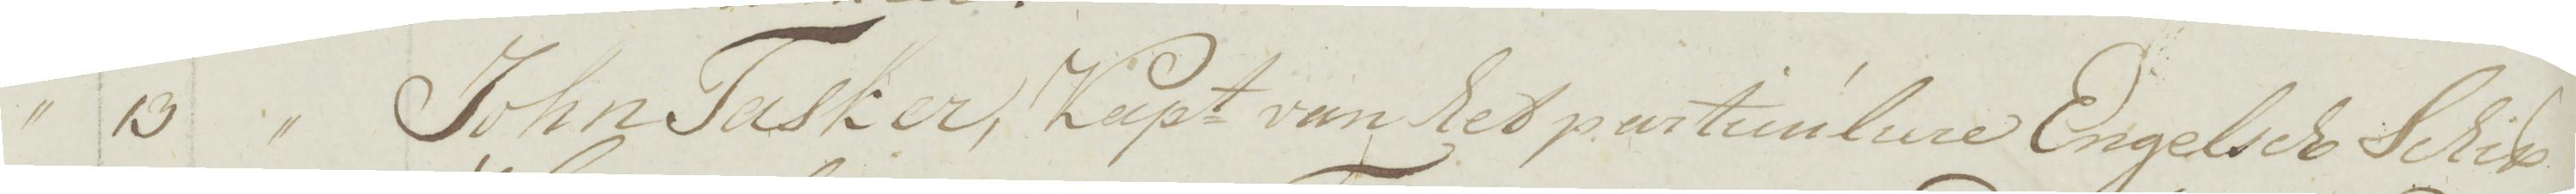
„ 13 „ John Tasker, Kap:t van het particuliere Engelsch Schip
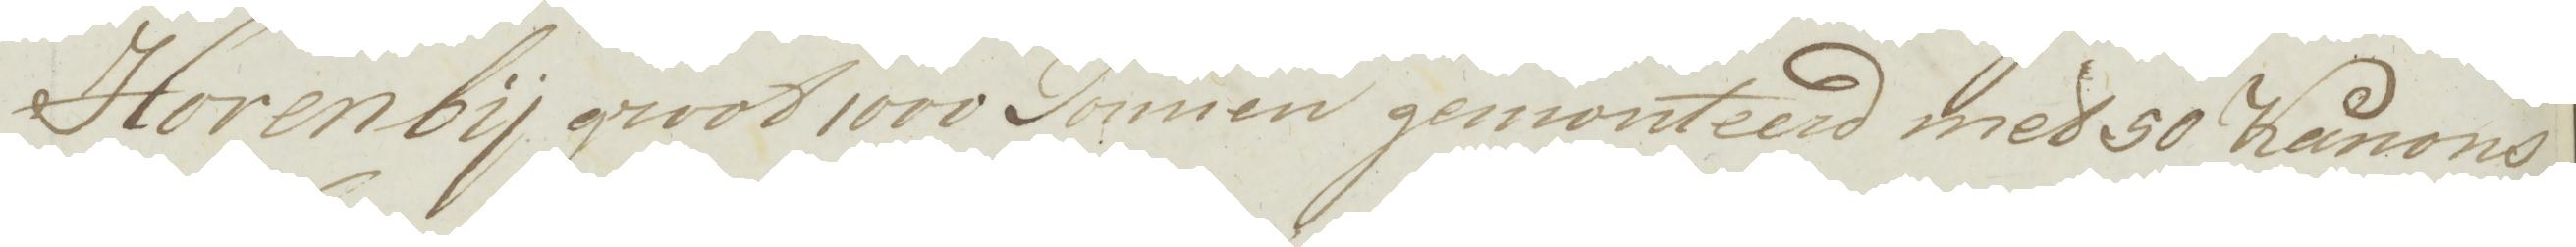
Horenbij groot 1000 Tonnen gemonteerd met 50 kanons
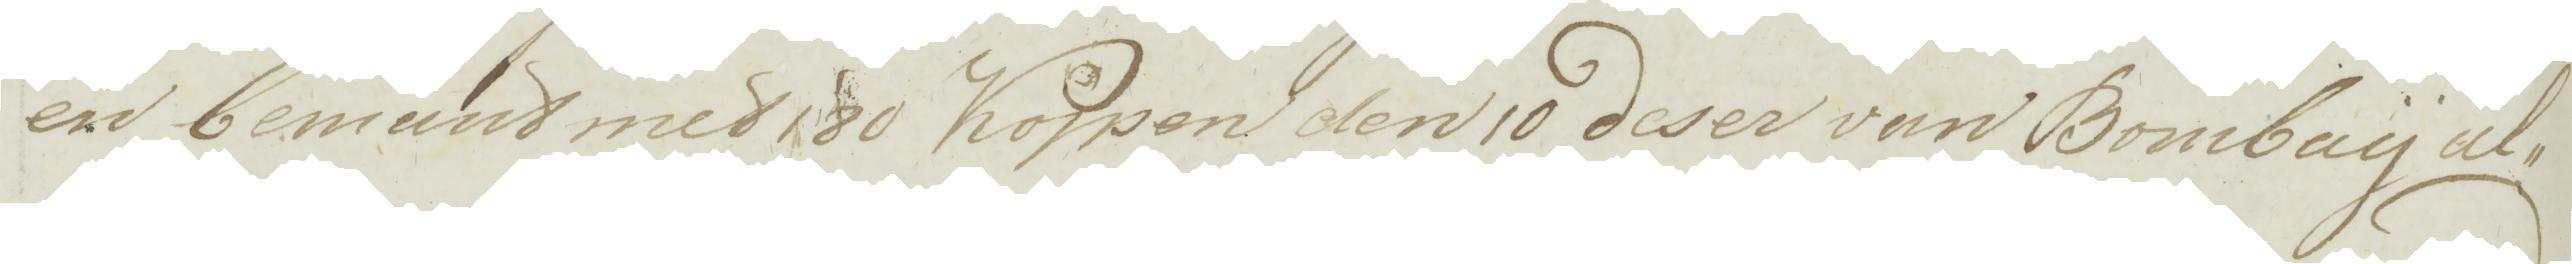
en bemant met 180 Koppen den 10 deser van Bombaij al„
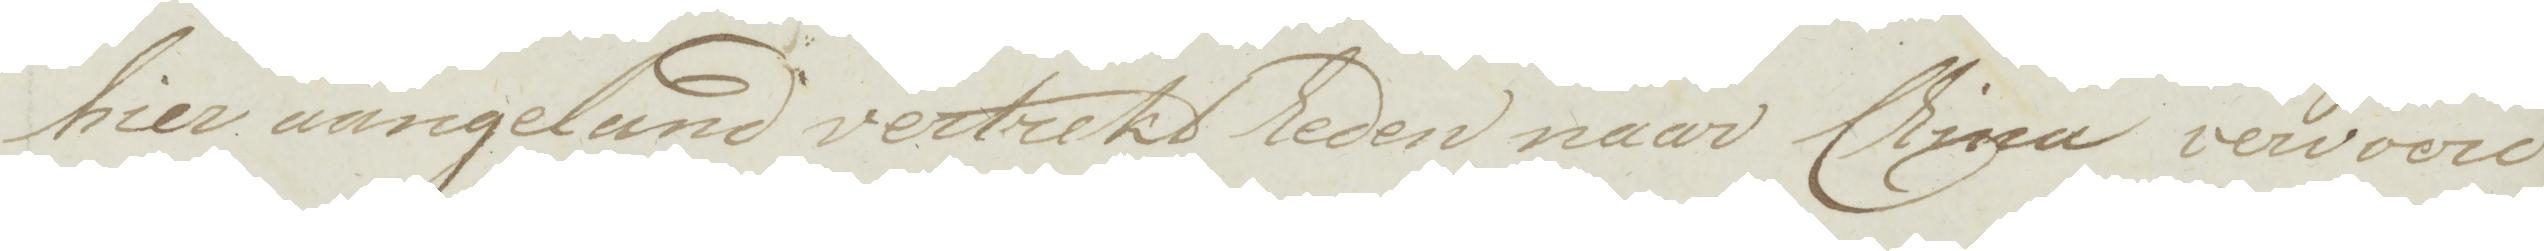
hier aangeland vertrekt heden naar China vervoerd
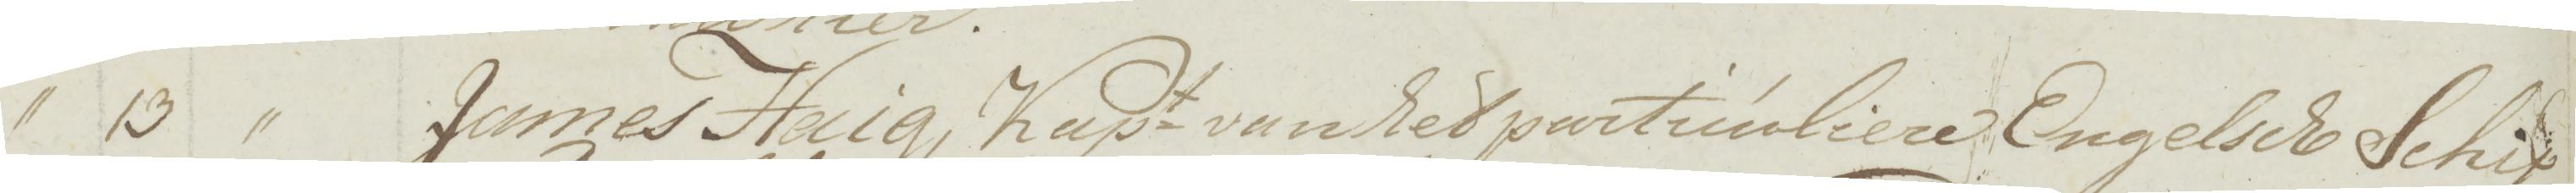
„ 13 „ James Haig, Kap=t van het particuliere Engelsch Schip
